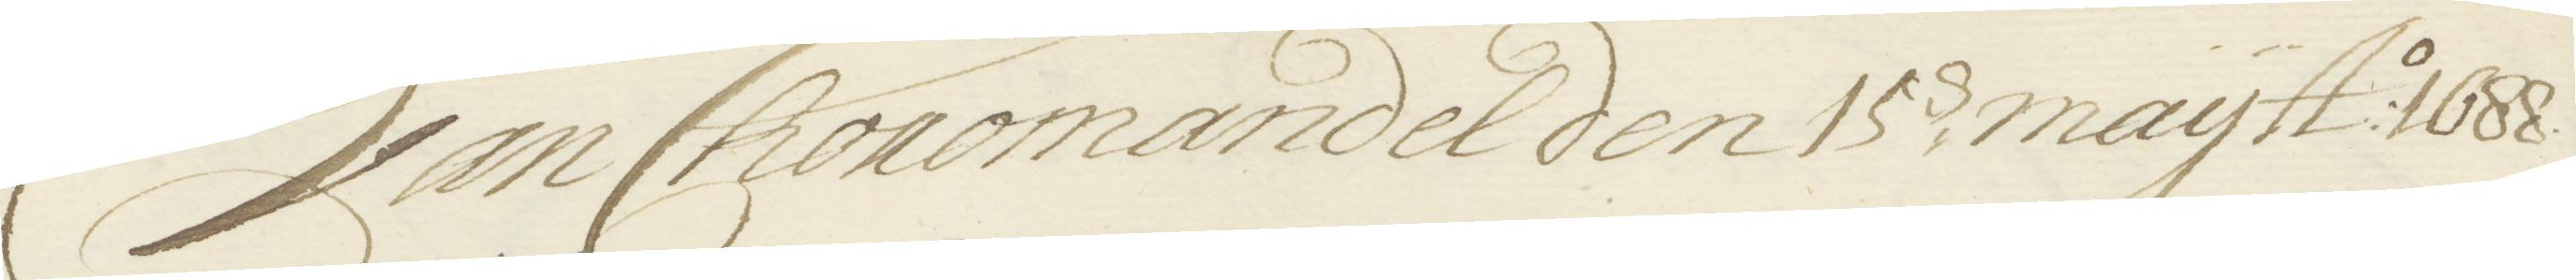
Van Choromandel den 15„' maij A:o 1688.
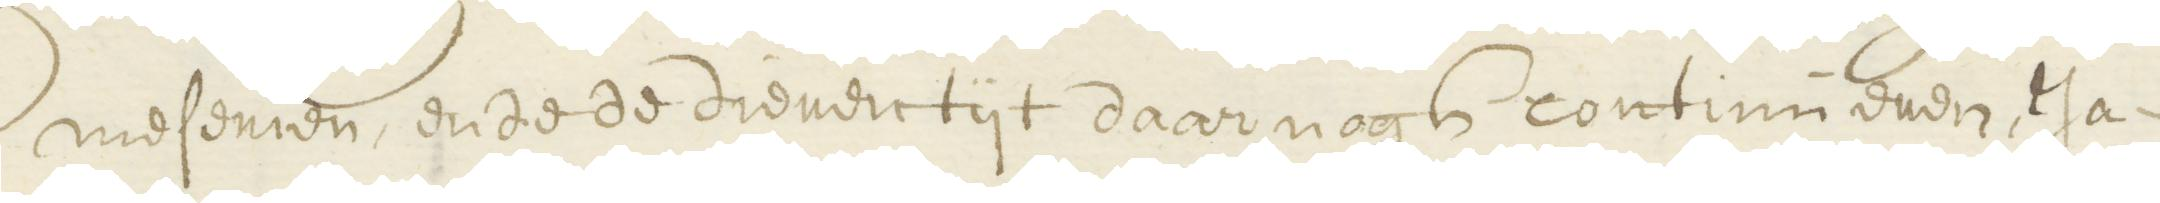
meserien, ende de dienen tijt daar nogh continueren, Ja
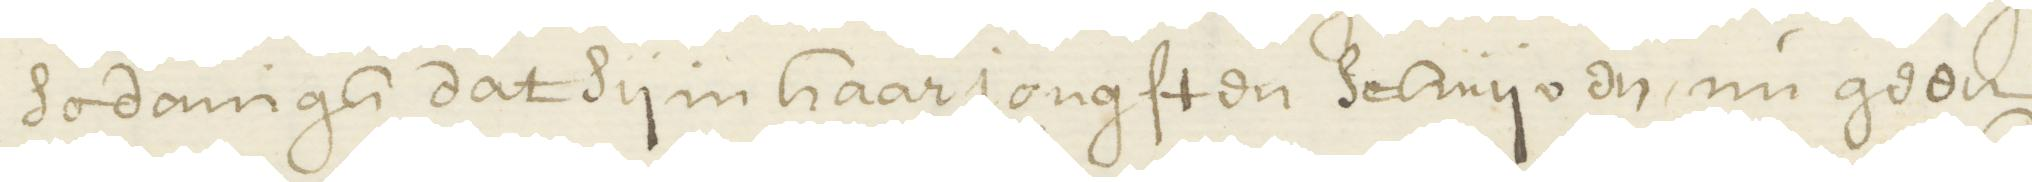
sodanigh dat sij in haar jongsten schrijven, nu geen
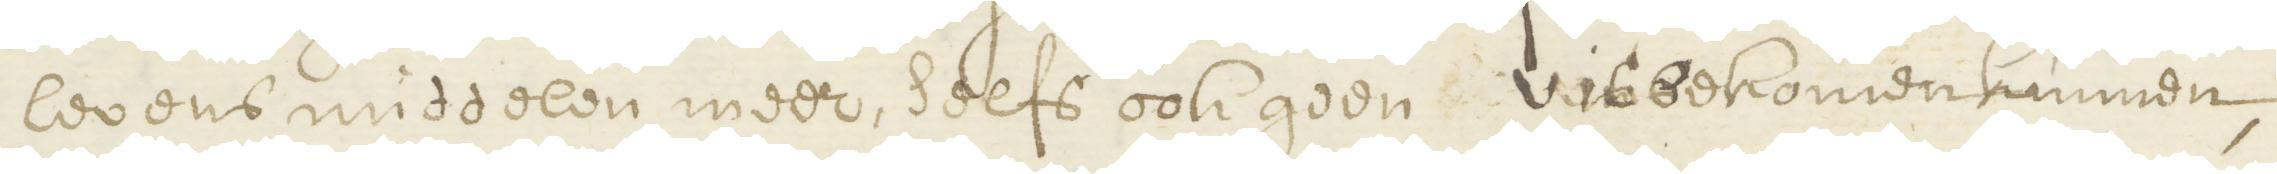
levens middelen meer, selfs ook geen vis bekomen kunnen,
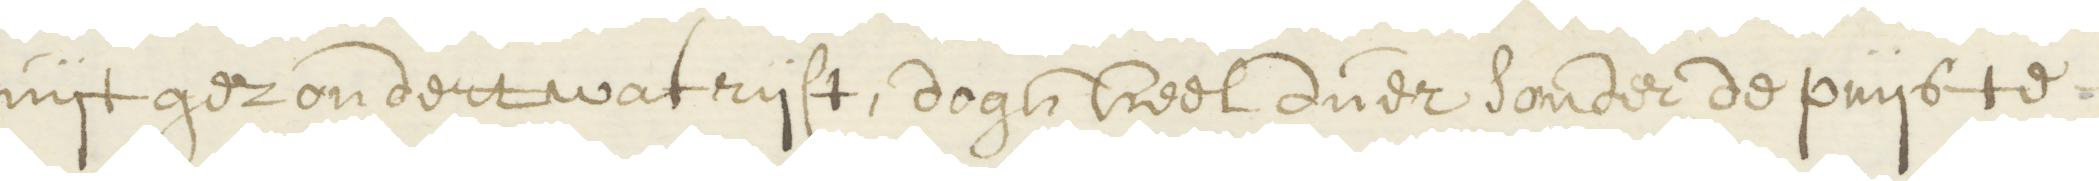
uijt gezondert wat rijst, dogh heel duer sonder de prijs te
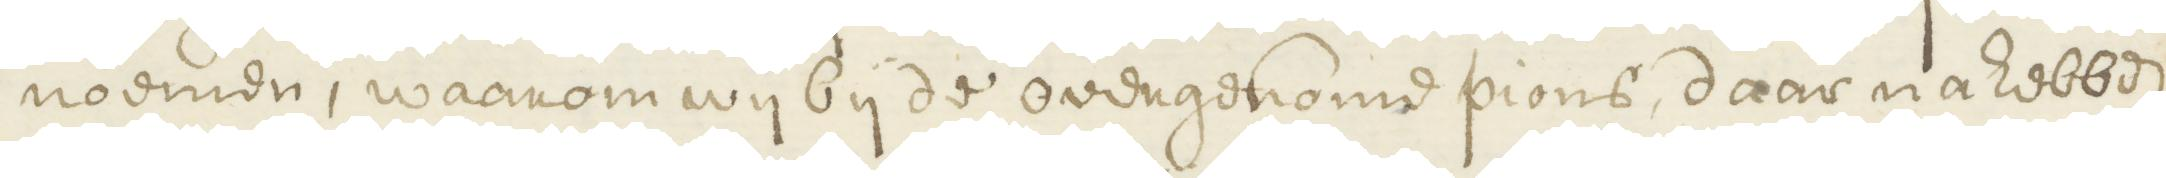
noemen, waarom wij bij de overgekome pions, daar na hebben
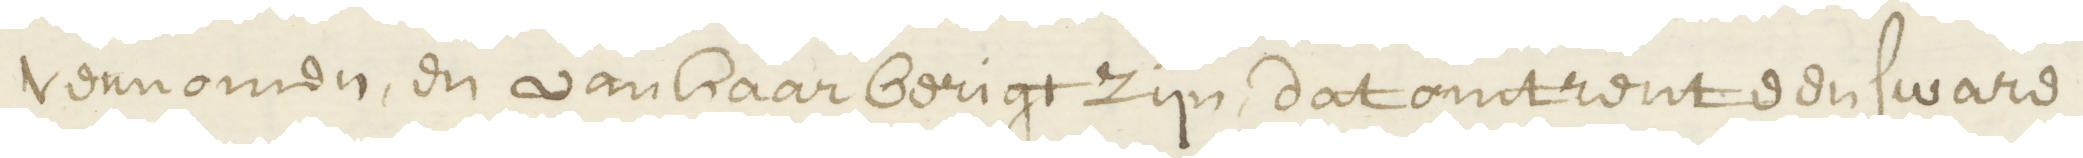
vernomen, en van haar berigt zijn, dat omtrent een sware
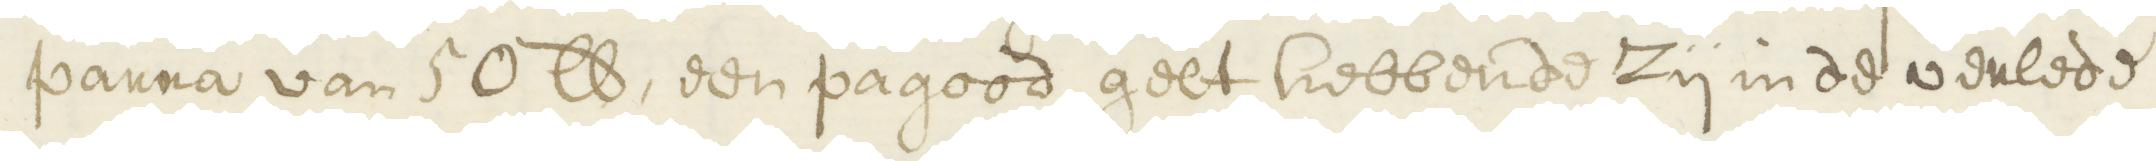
parra van 50 lb, een pagood gelt hebbende zij in de verlede
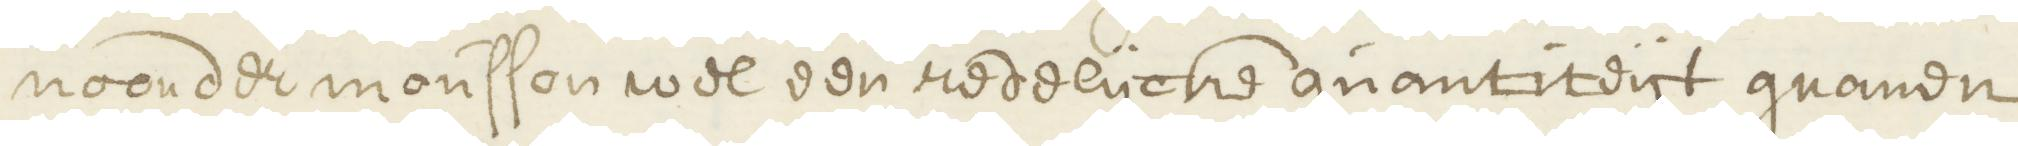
noorder mousson wel een redelijcke quantiteijt granen
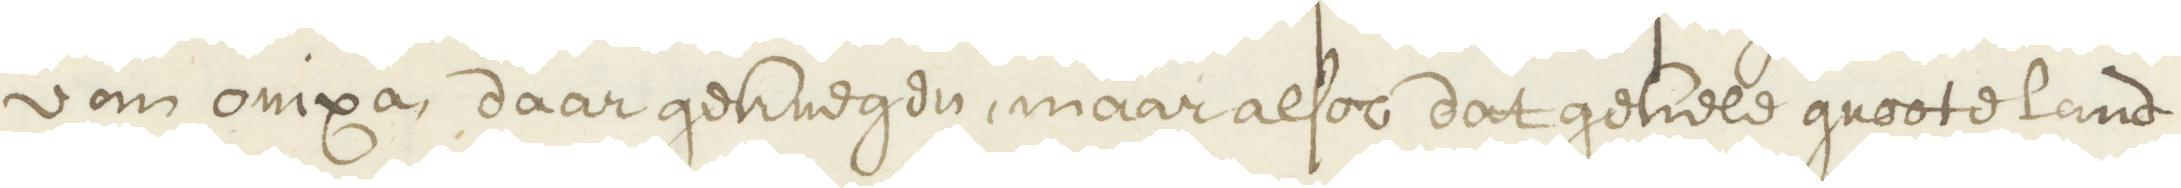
van onixa, daar gekregen, maar alsoo dat gehele groote land
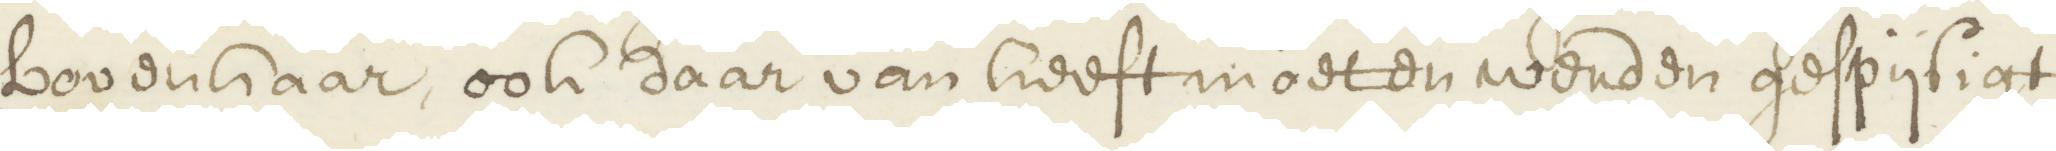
bovenhaar, ook daar van heeft moeten werden gespijsigt
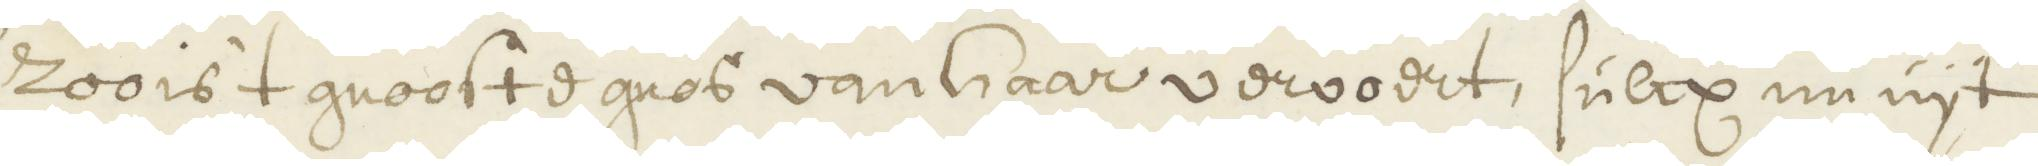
zoo is ’t grooste gros van haar vervoert, sulcx nu uijt
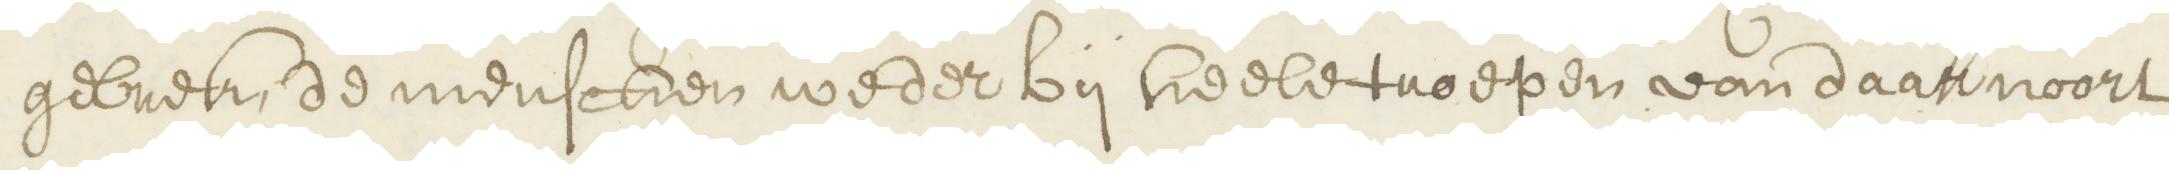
gebrek, de menschen weder bij heele troepen van daar noort
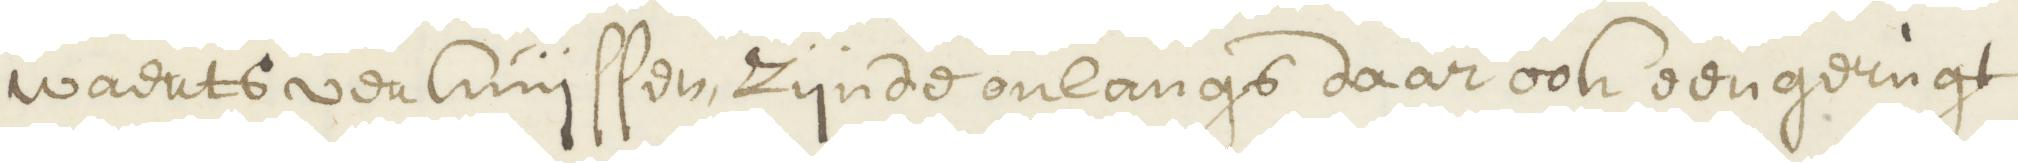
waerts verhuijssen, zijnde onlangs daar ook een gerugt
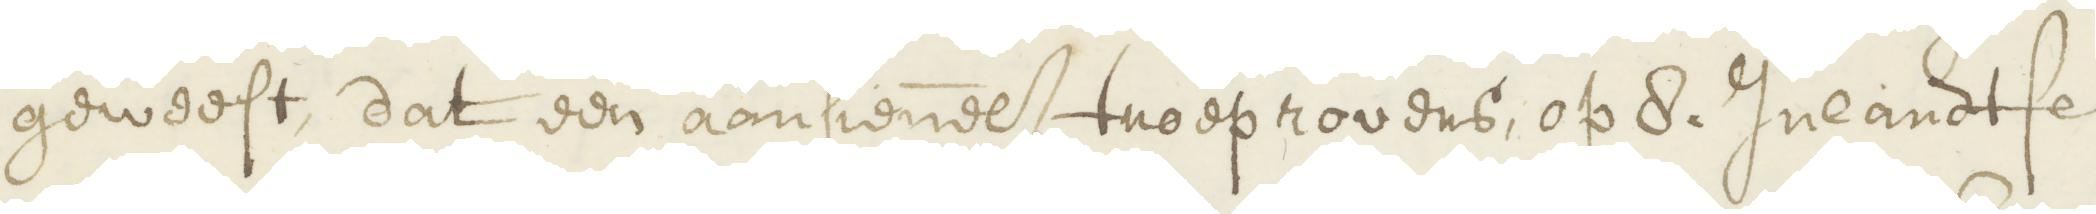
geweest, dat een aansienelijk troep rovers, op 8. Inlandtse
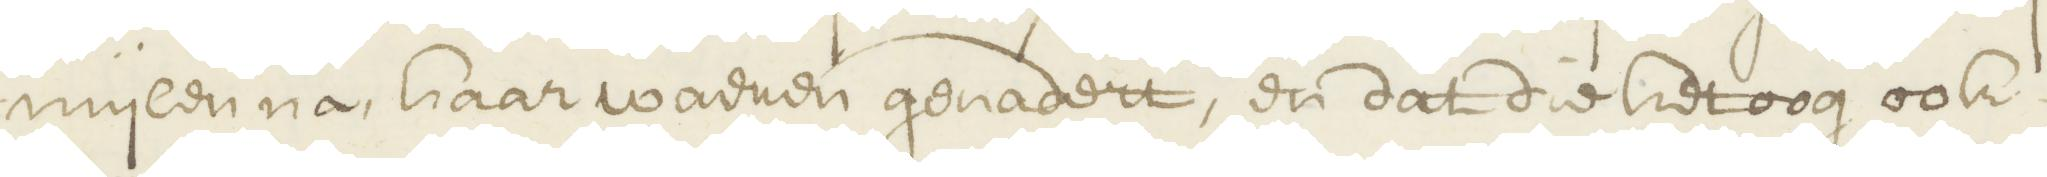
mijlen na, haar waeren genadert, en dat die het oog ook
